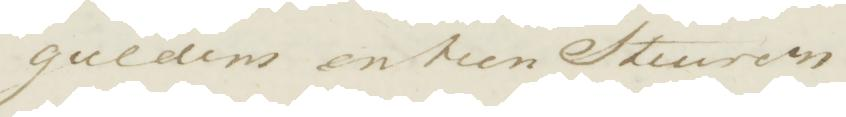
guldens en tien Stuivers - - - - - -
